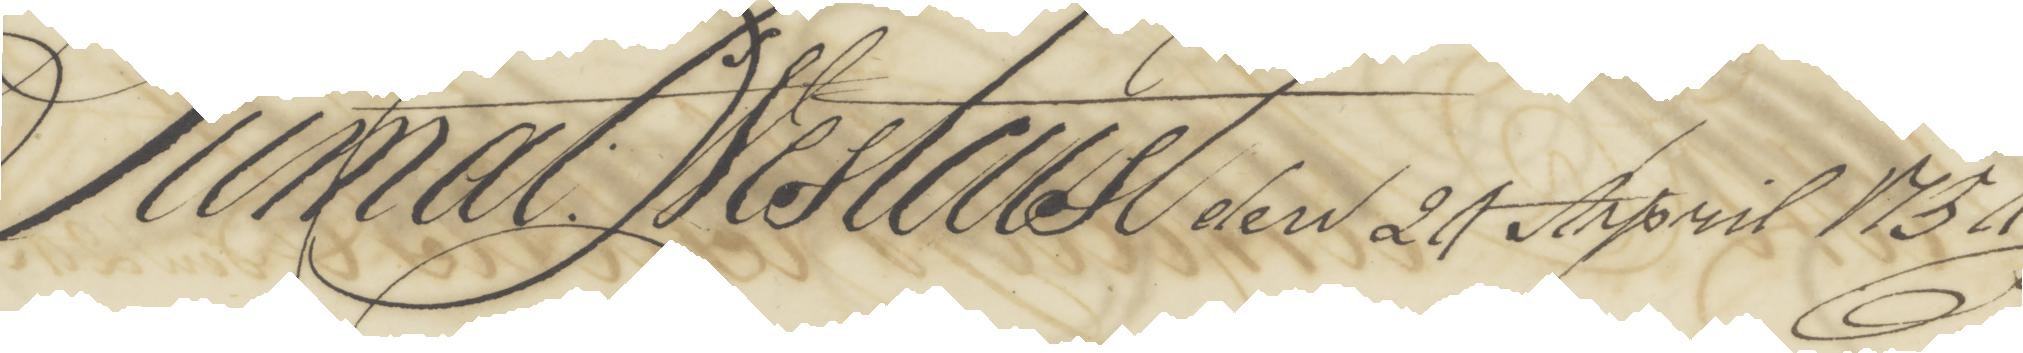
Sumat Westcust den 24 April 1754
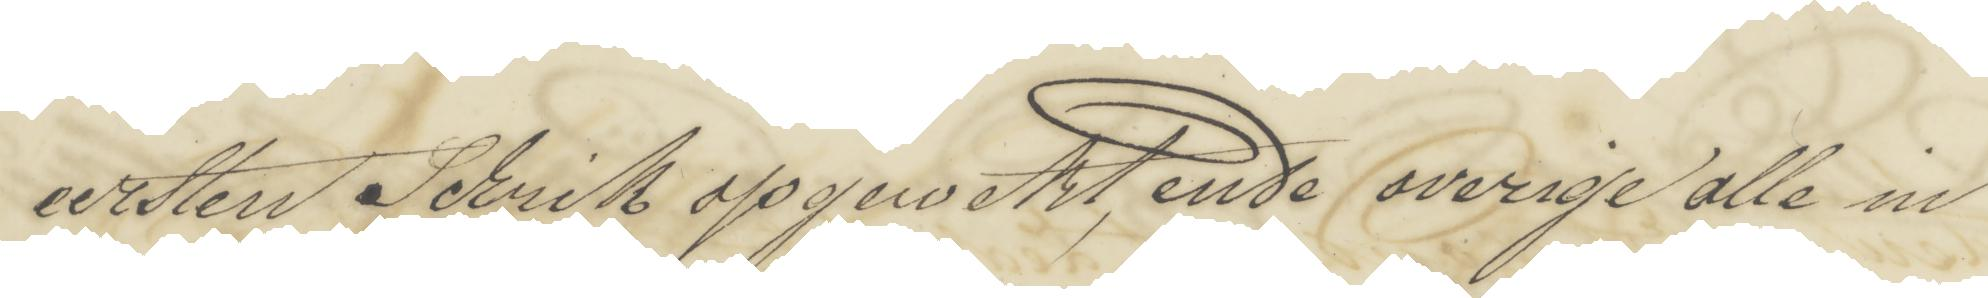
eersten schrik op gewekt, ende overige alle in
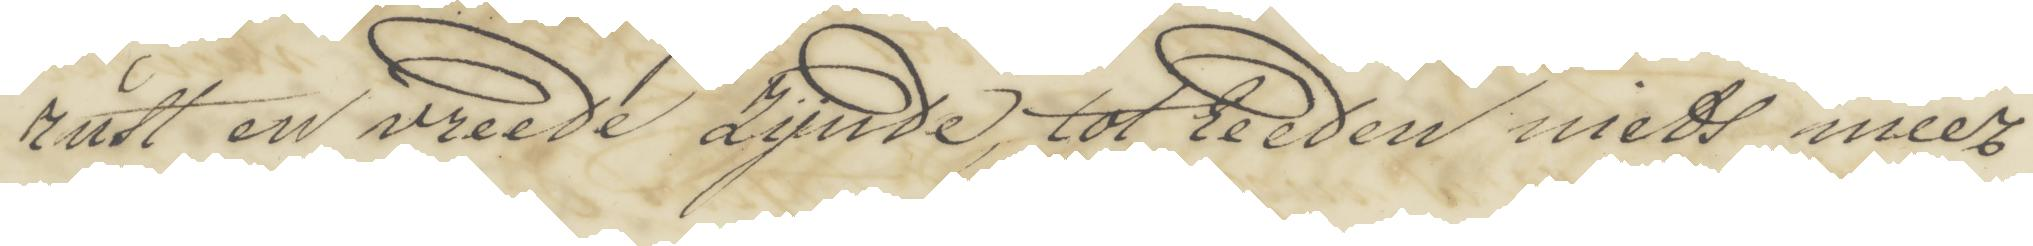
rust en vreede Zijnde, tot heden niets meer
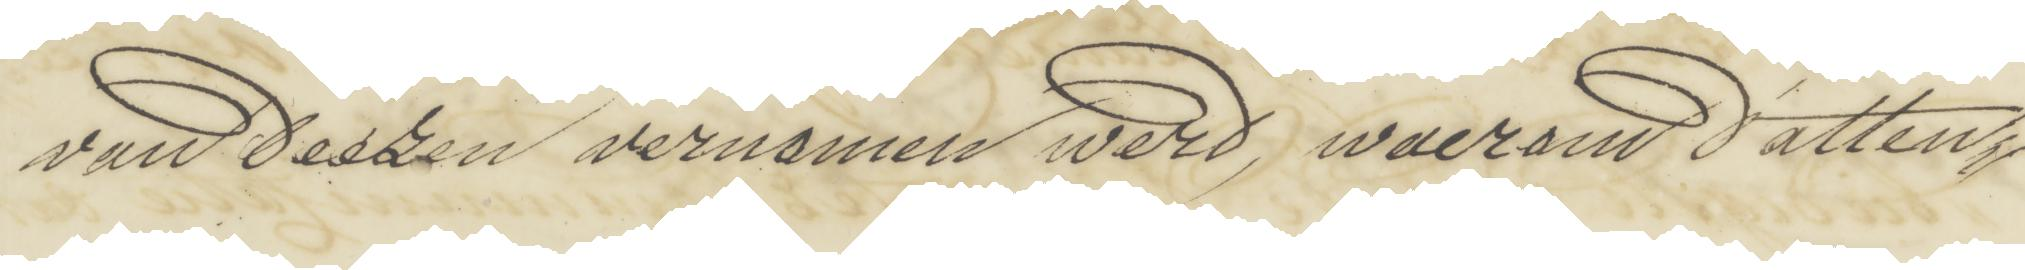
van deezen vernomen werd, waerom d’atten„
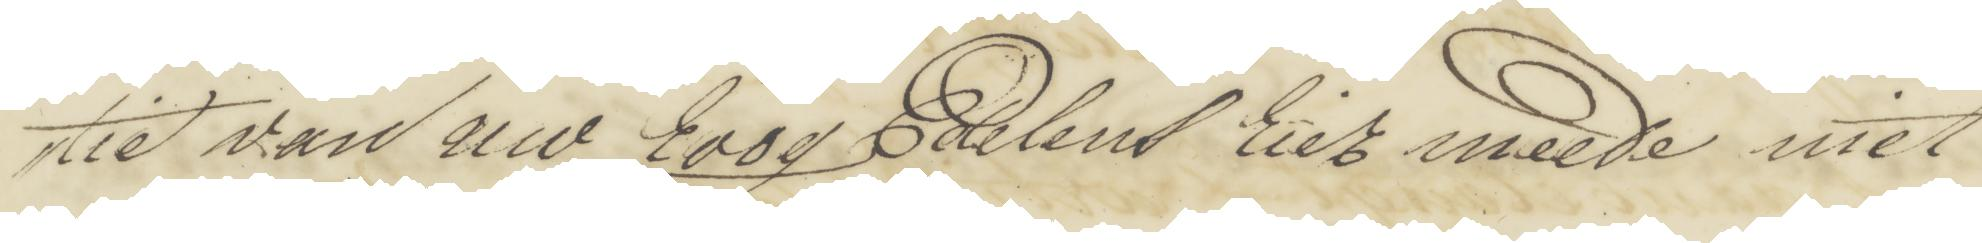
„tie van uw hoog Edelens hier meede niet
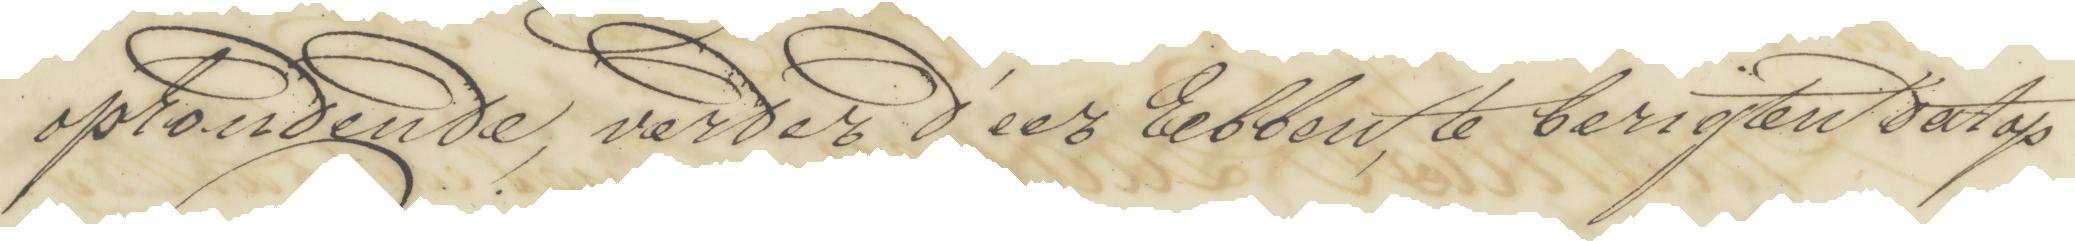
ophoudende, verder d’ eer hebben, ’t berigten dat op
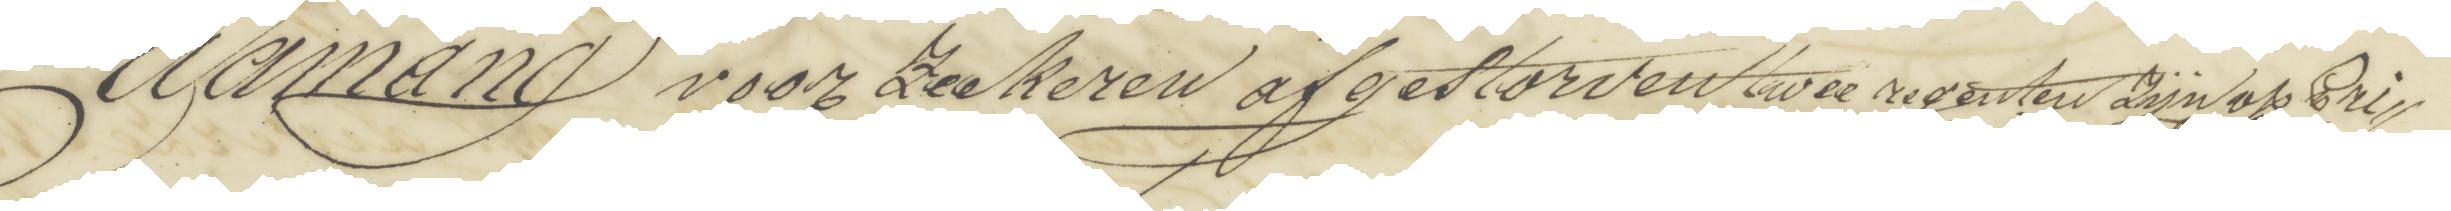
Priamang voor Zeekeren afgestorven twee regenten zijn op Pri„
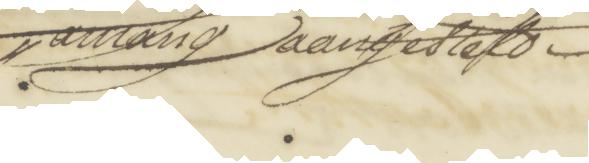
amang aangesteld.
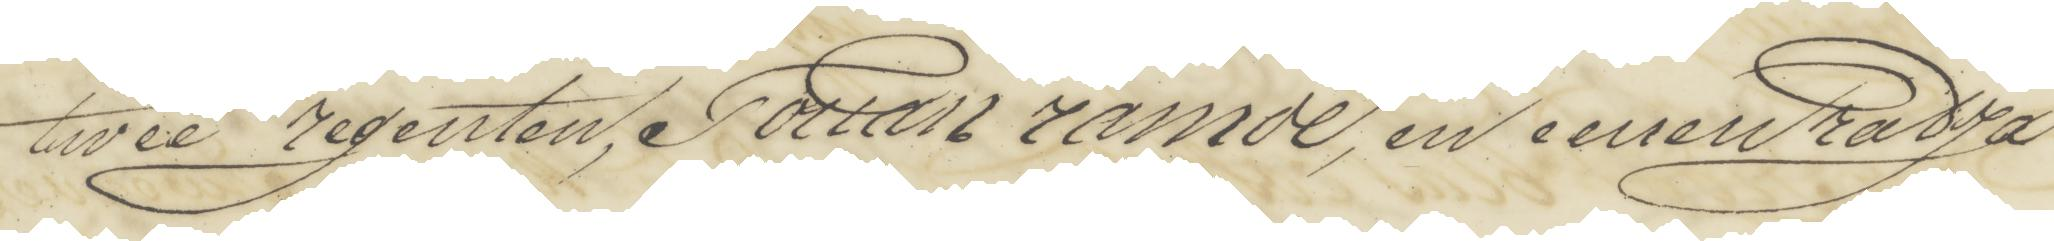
twee regenten, Touan ramde, en eenen radja
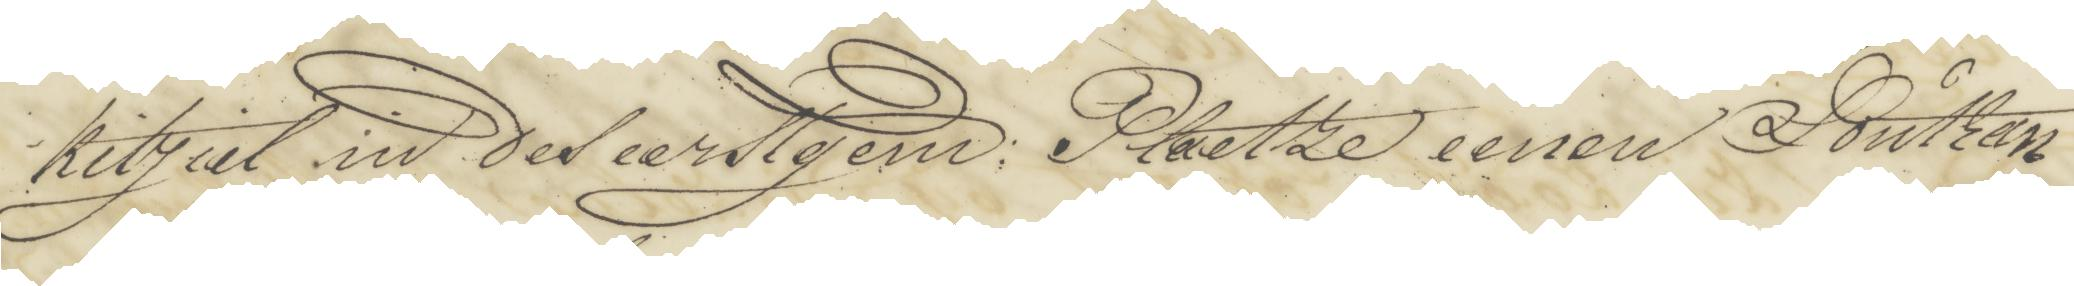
Kitjiel in des eerstgem: Plaetze eenen Southan
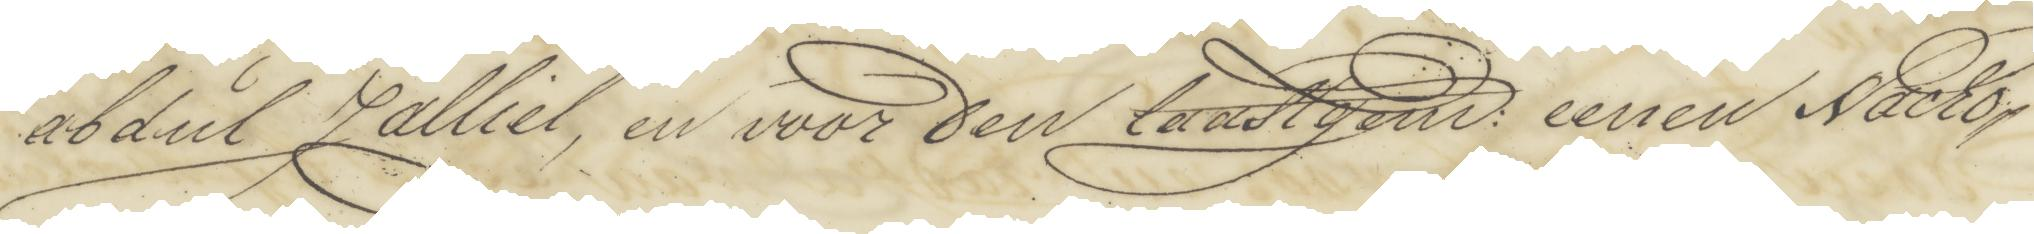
abdul Jalliel, en voor den laastgem: eenen Nacho„
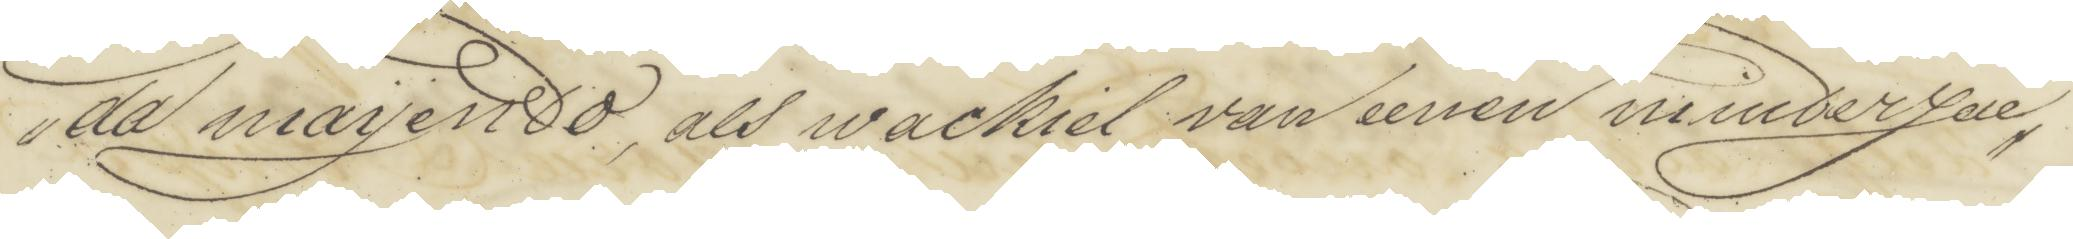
„da maijendo, als wackiel van eenen minderjae„
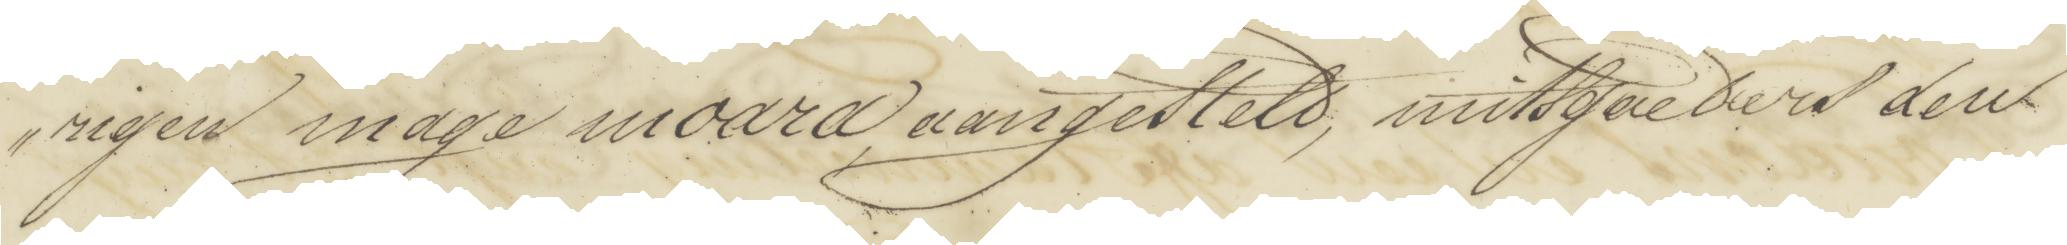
„rigen mage moara aangesteld, mitsgaeders den
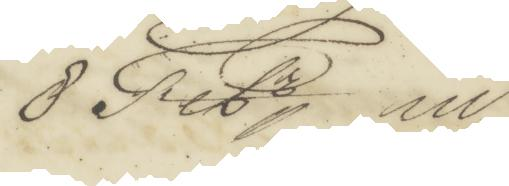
8 feb:r in
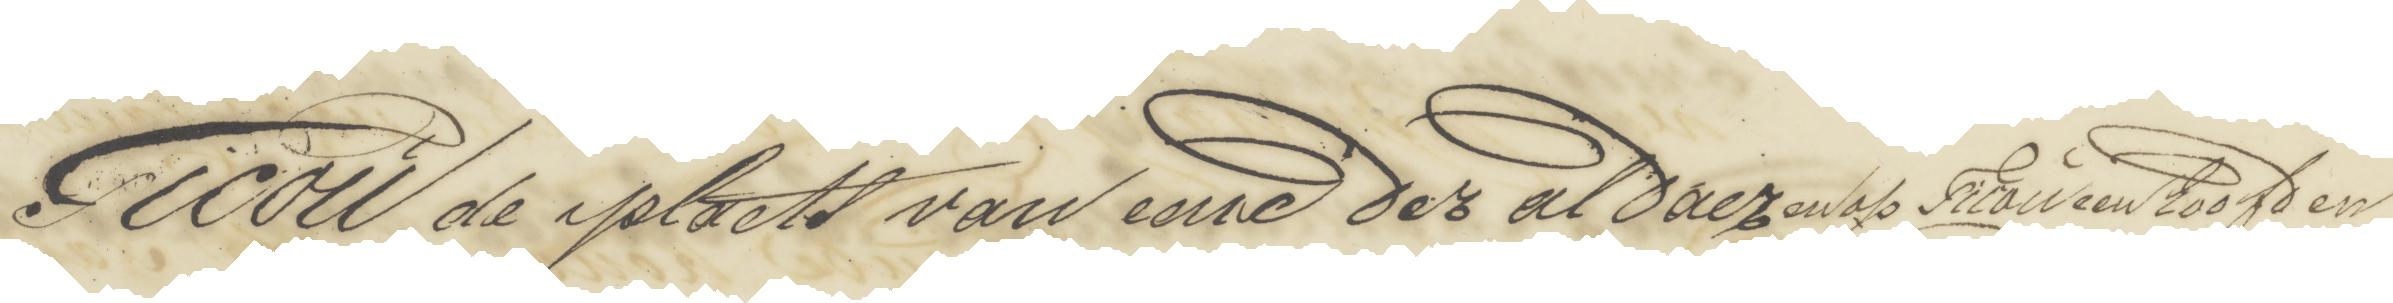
Ticou de plaets van eene der aldaer en op Ticou een hoofd en
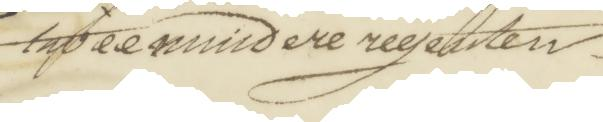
twee mindere regenten
